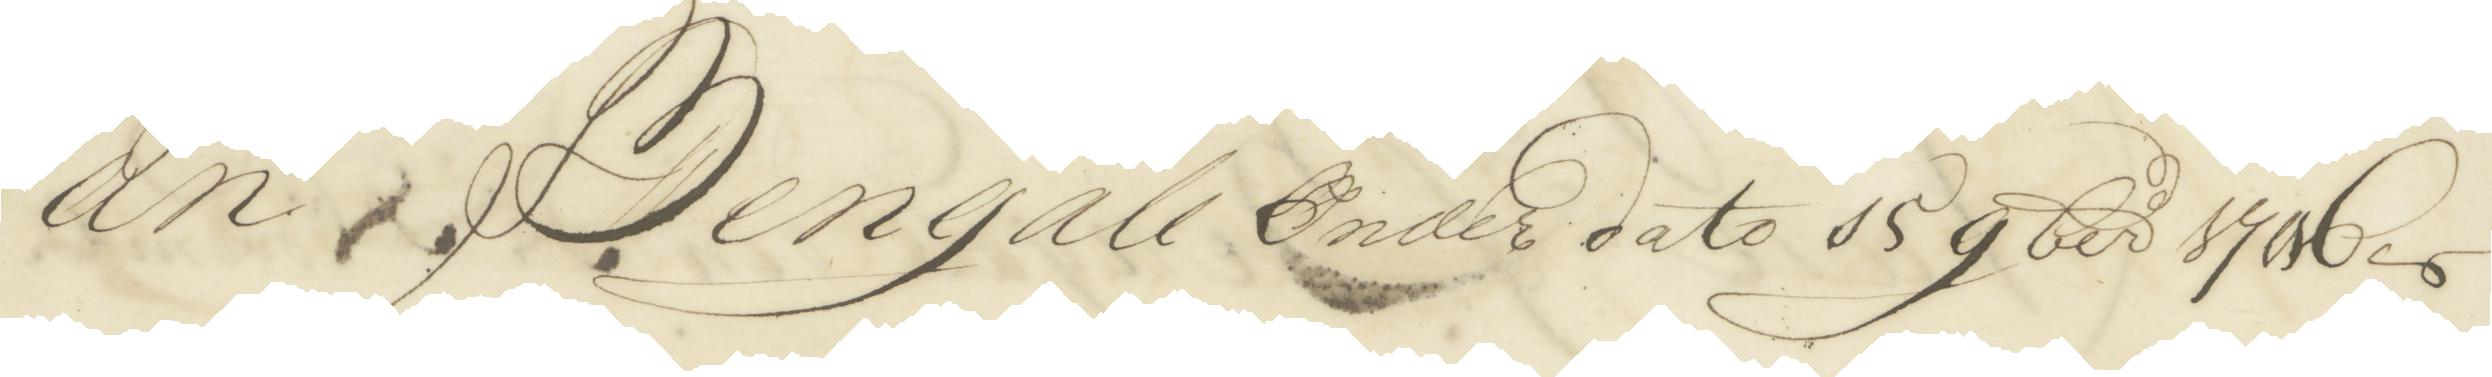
Van Bengale Onder dato 15 9ber 1746
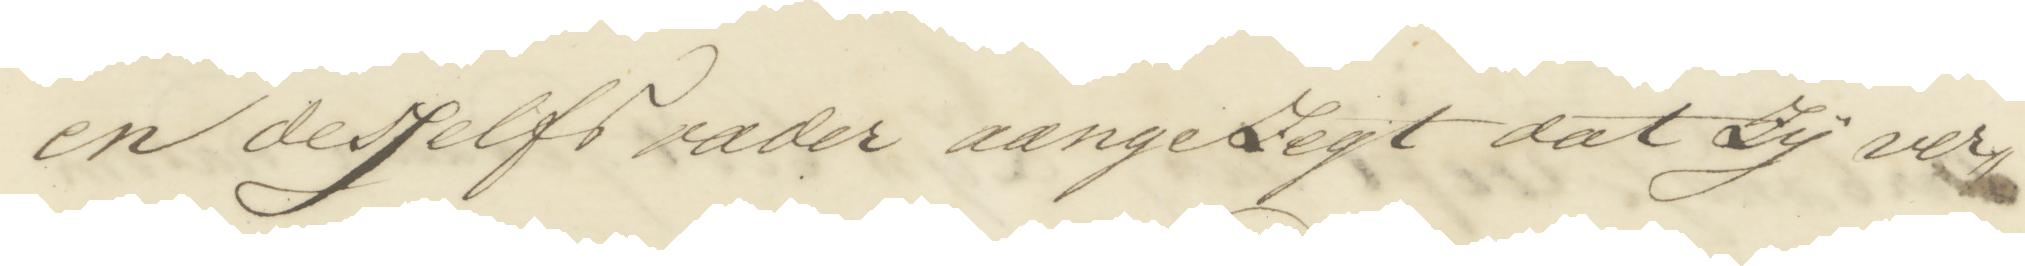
en desselfs vader aangezegt dat zij ver„
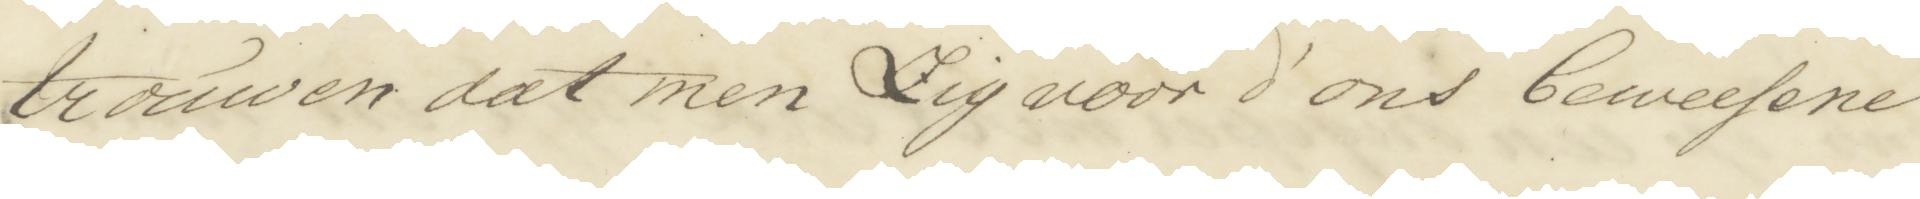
trouwen dat men zig voor d' ons beweesene
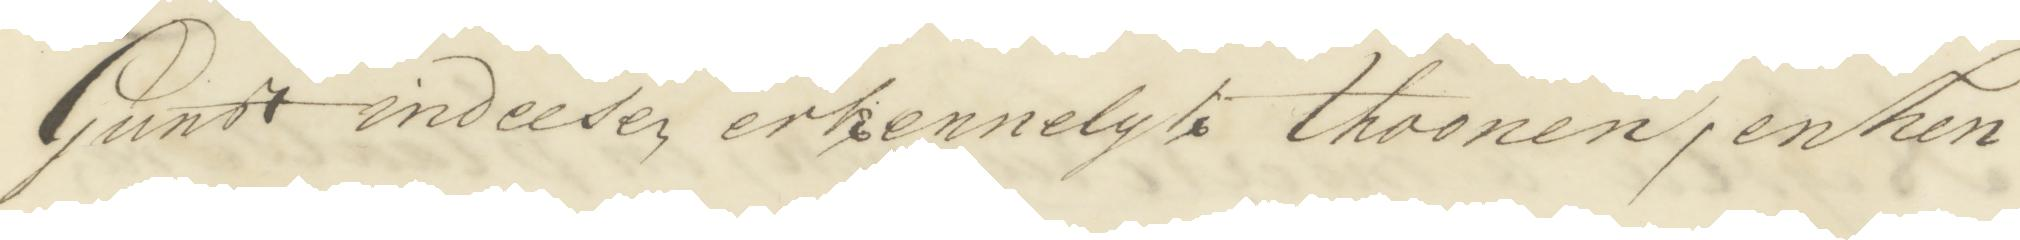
Gunst indeesen erkennelyk thoonen, en hen
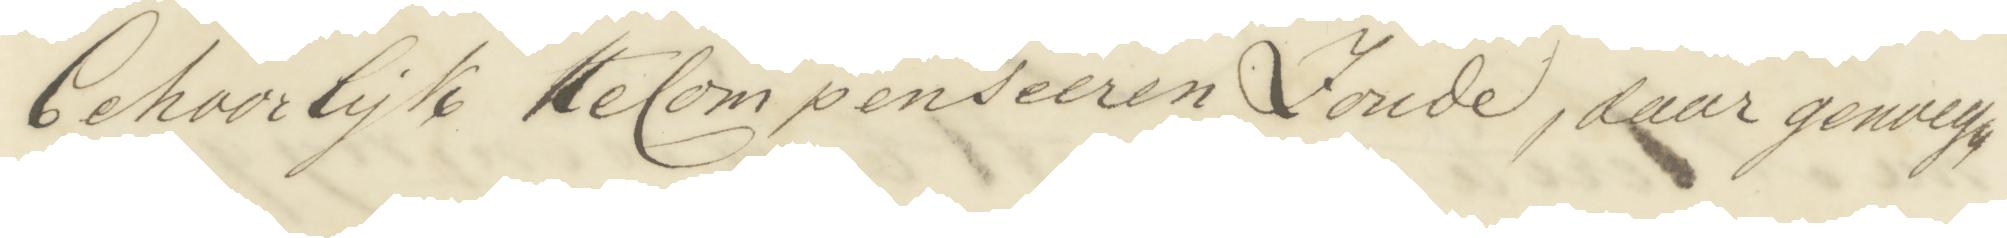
behoorlijk Recompenseeren zoude, daar genoeg„
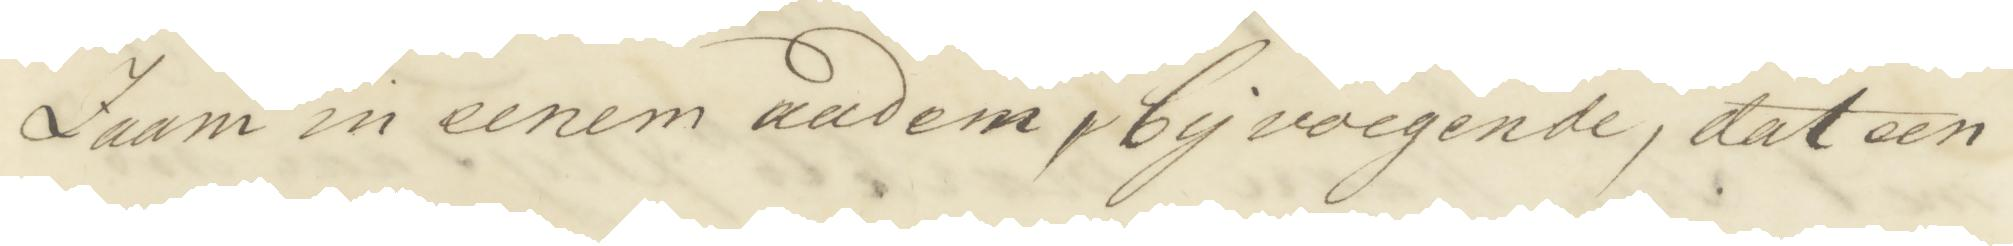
zaam in eenem aadem, bij voegende, dat een
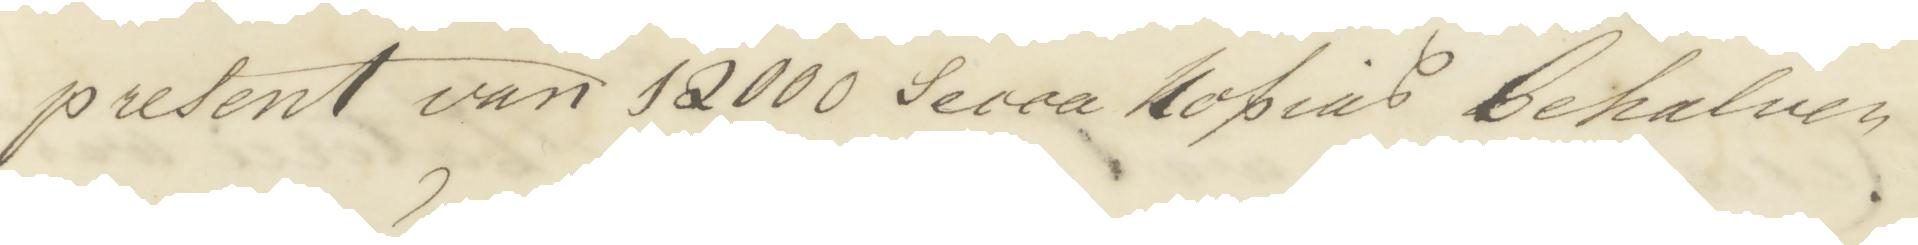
present van 12000 secca Ropias behalven
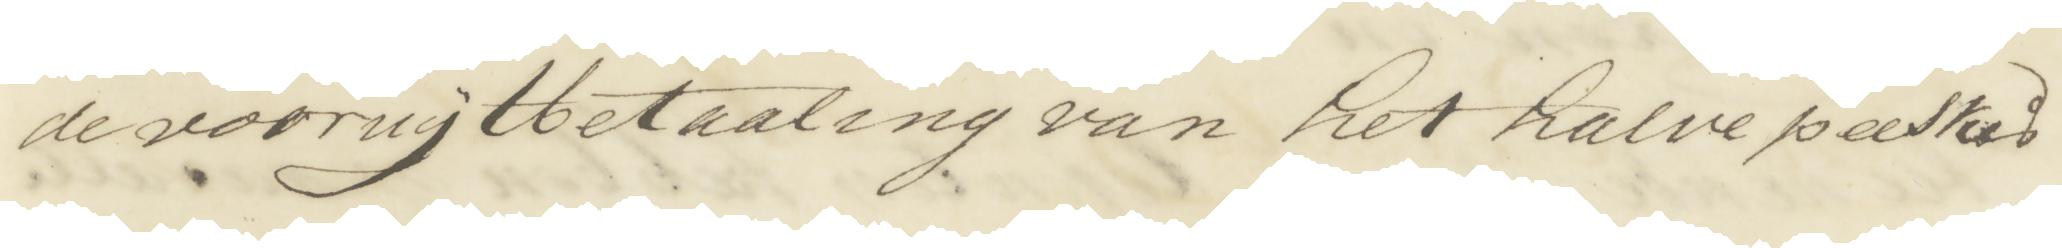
de vooruijtbetaaling van het halve peeskes
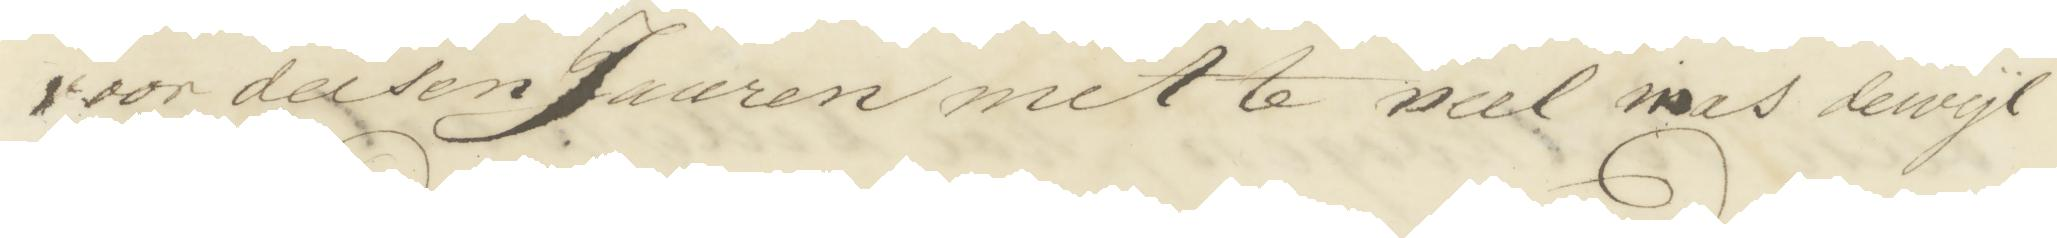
voor deesen Jaaren met te veel was dewijl
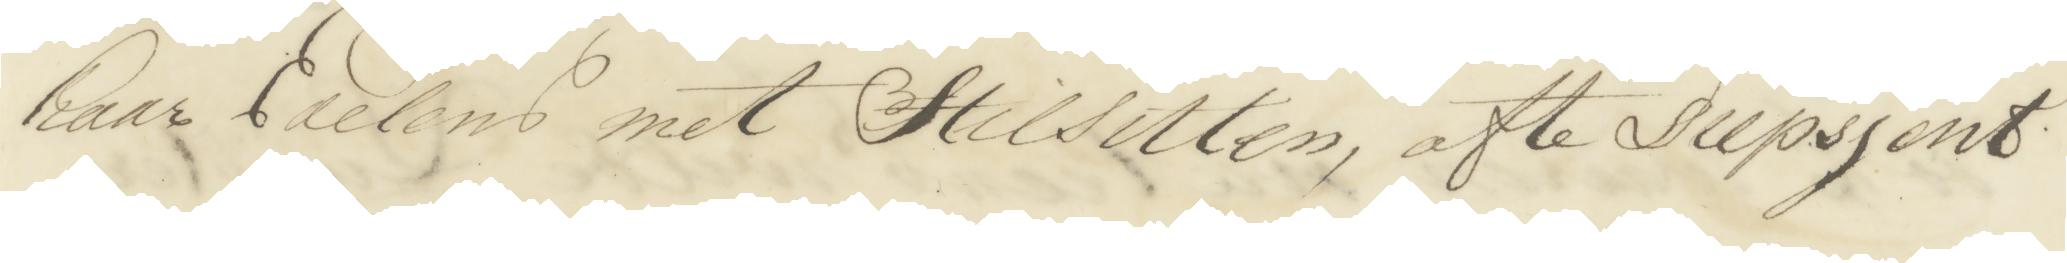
haar Edelens met stilsitten, ofte Diepsjent
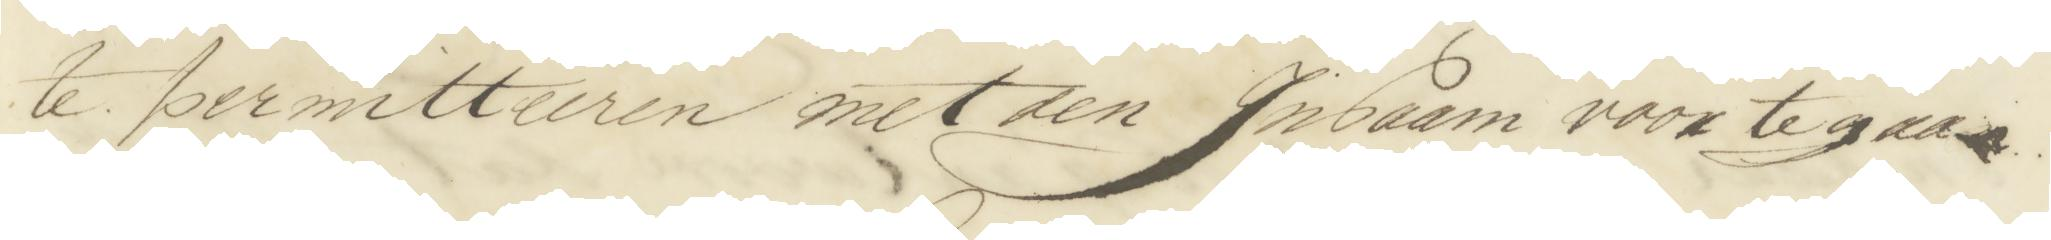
te permitteeren met den Jnsaam voor te gaan
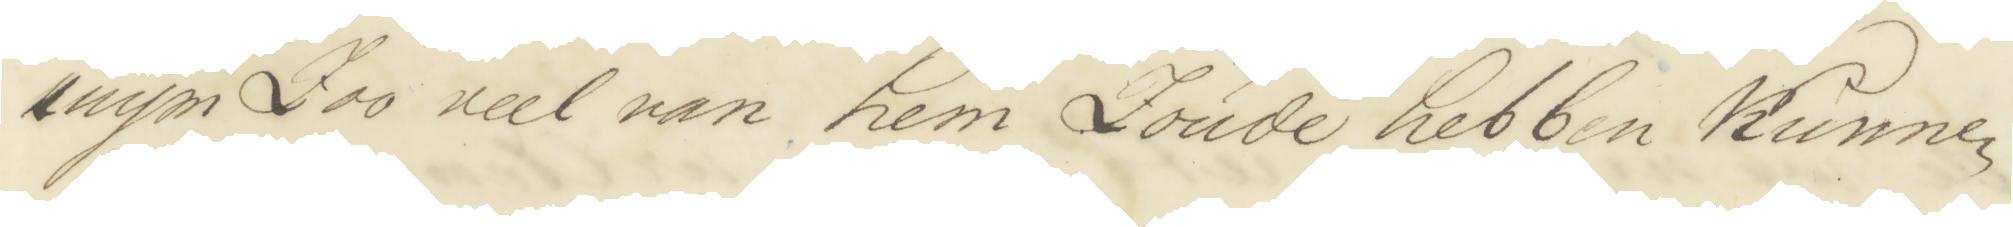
ruijm zoo veel van hem zoude hebben kunnen
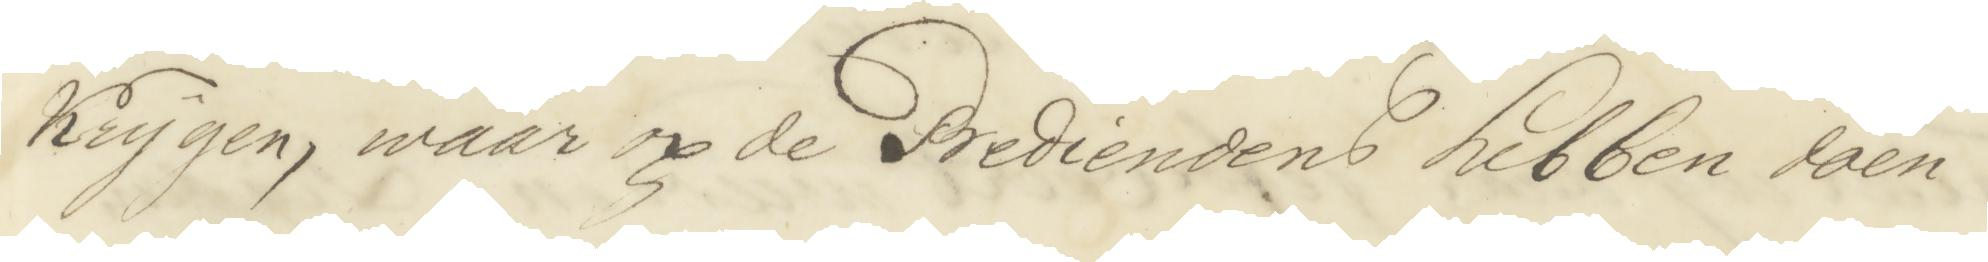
krijgen, waar op de Bediendens hebben doen
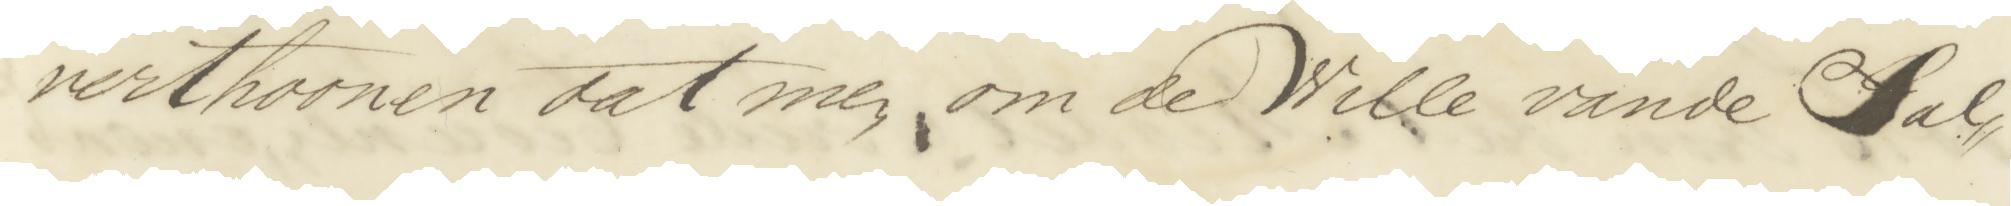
verthoonen dat men om de Wille vande Sal„
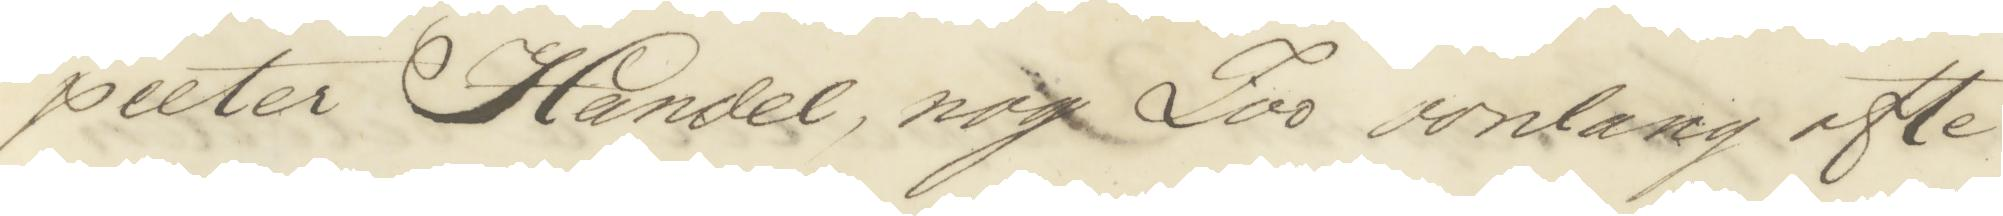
peeter Handel, nog zoo overlang ofte
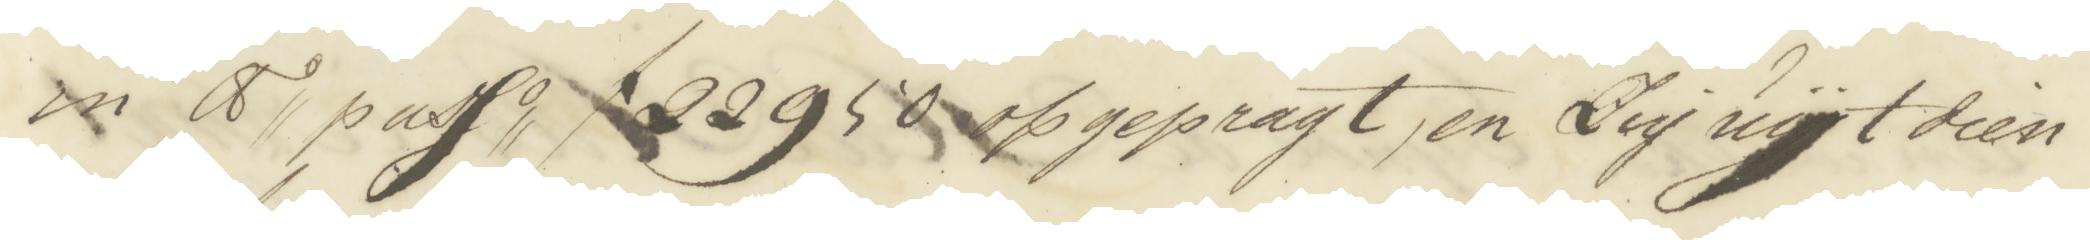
in a„o pass„o ƒ 22950 op gepragt, en zeij uijt dien
